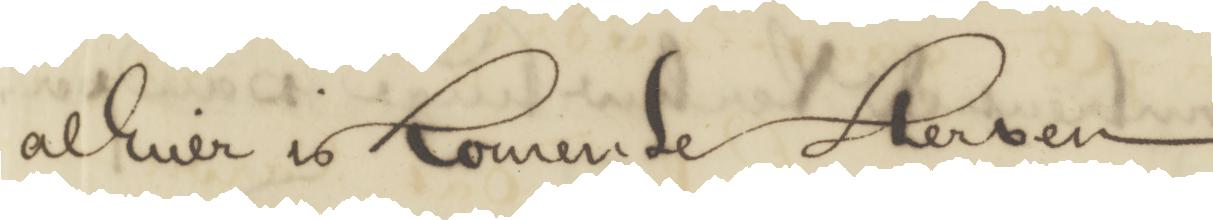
alhier is Komen te Sterven
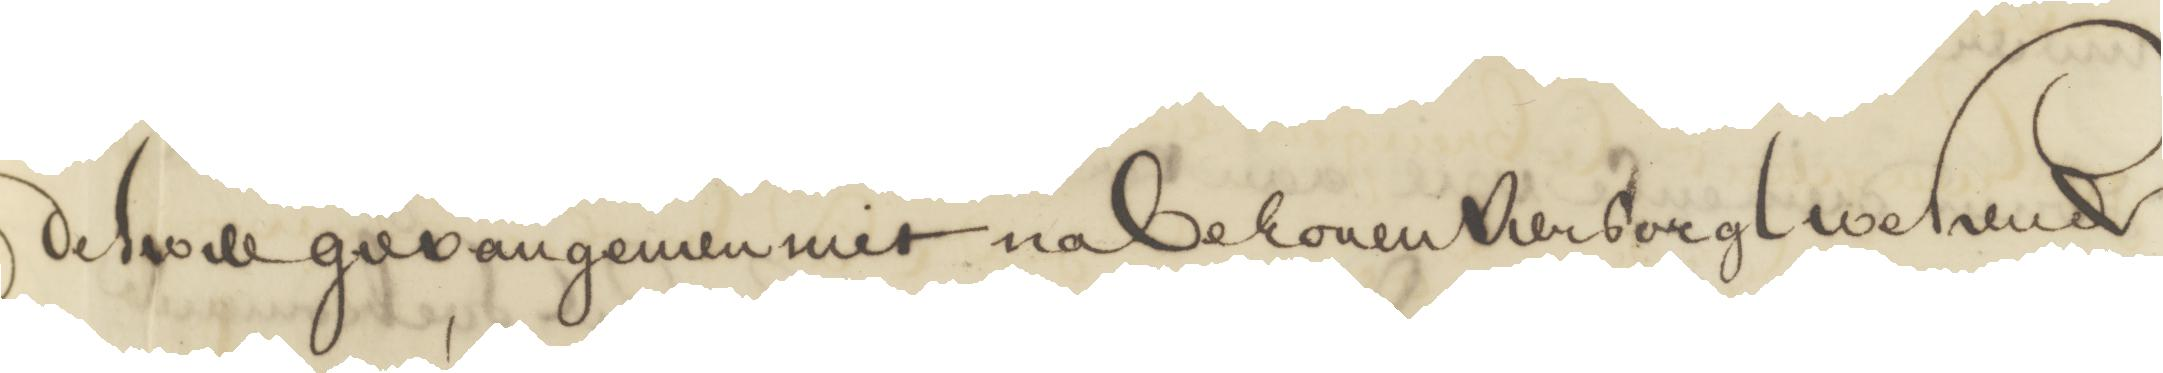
de twee gevangenen niet na Behoren Versorgt wesende
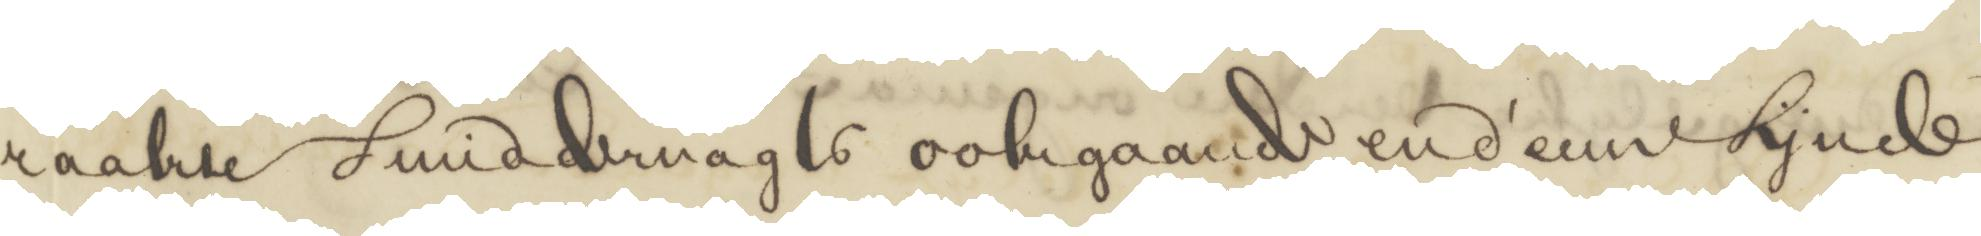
raakte 'S middernagts ook gaande en d’eene Sijnde
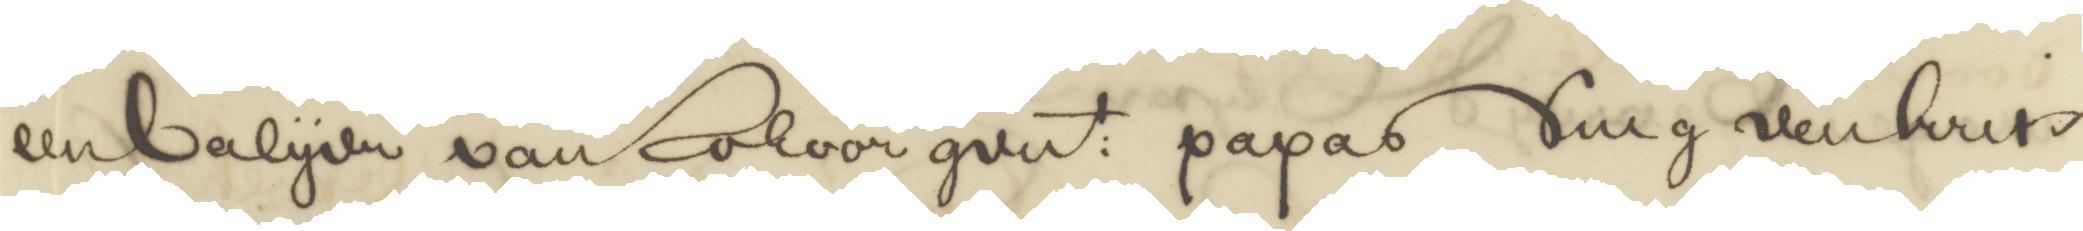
een Balijer van Johoor gen:t papassing een krits
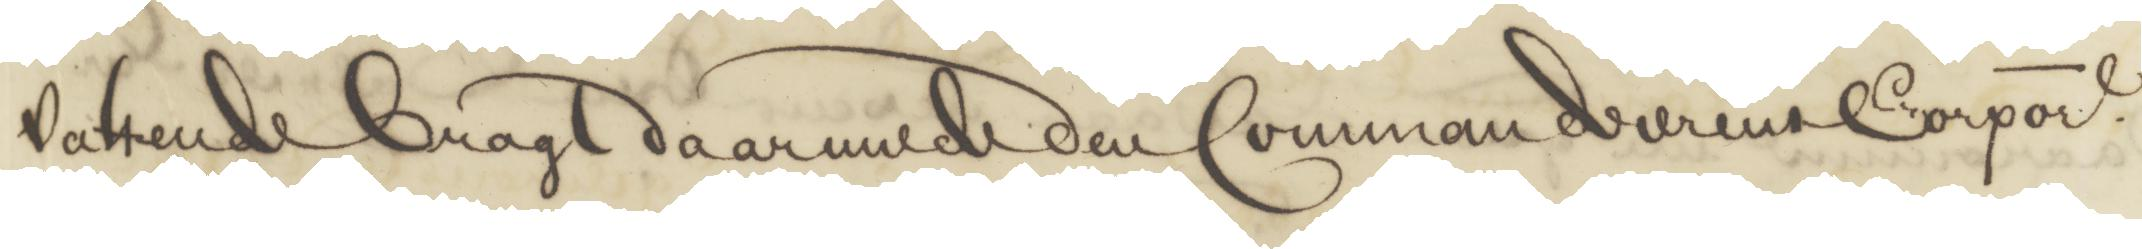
vattende Bragt daarmede den Commandeerent Corpor.l
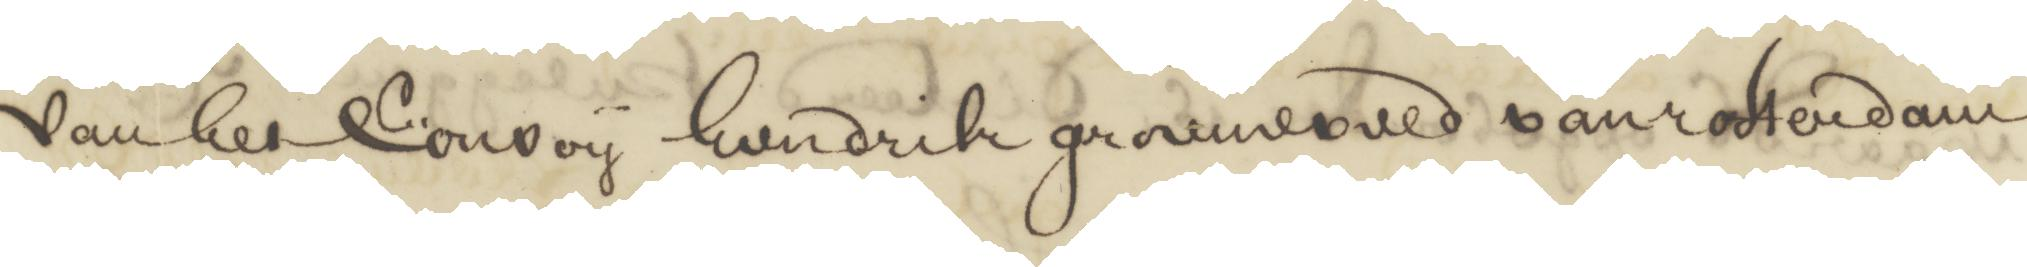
van het Convoij hendrik groeneveld van rotterdam
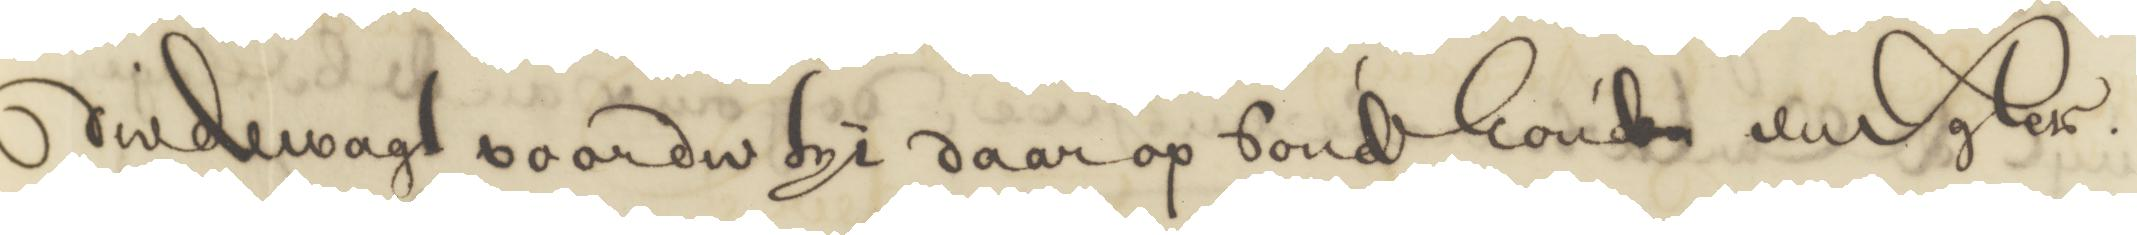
die de wagt voor die tijt daar op soude houden en Egter.
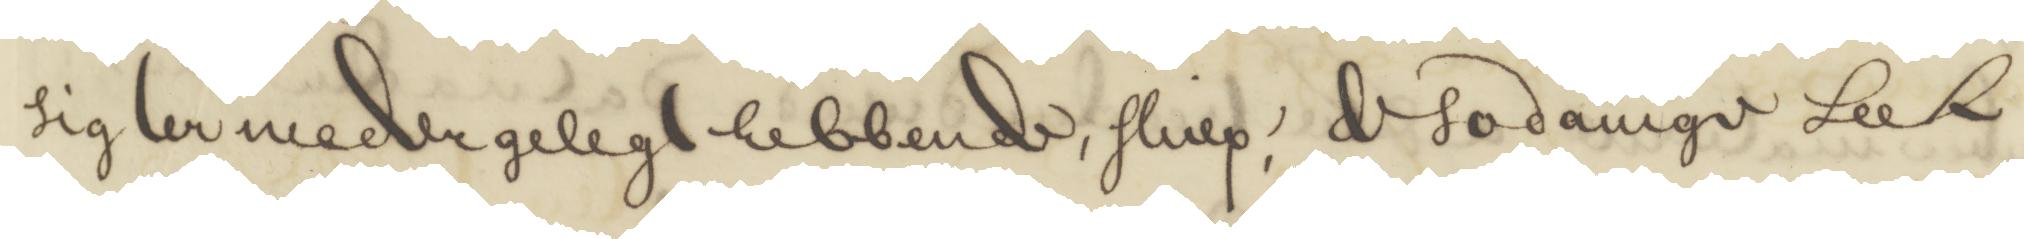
sig ter neder gelegt hebbende, sliep, de sodanige seek
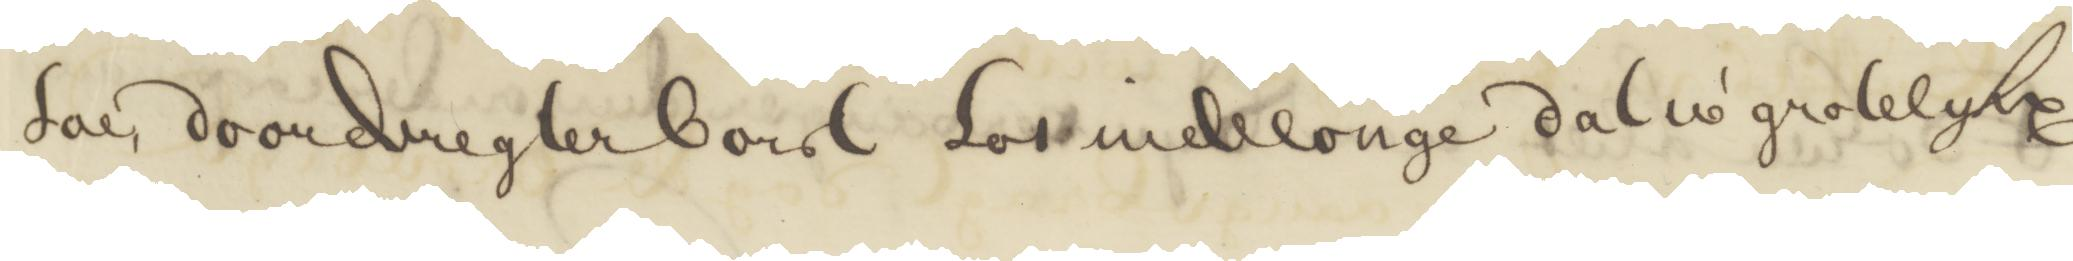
toe, door de regter borst tot in de longe dat w' grotelijk
